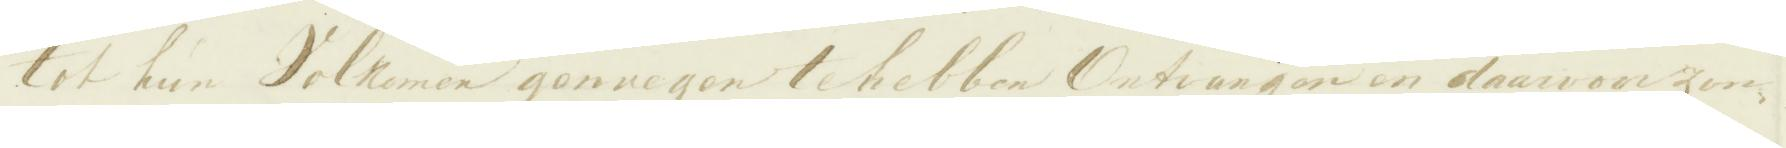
tot hun Volkemen genoegen te hebben Ontvangen en daarvoor zon„
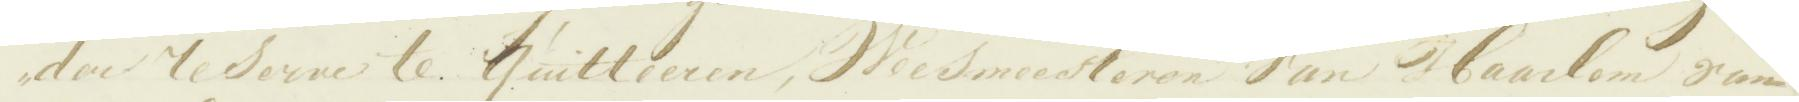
„der reserve te Quitteeren, Weesmeesteren van Haarlem van
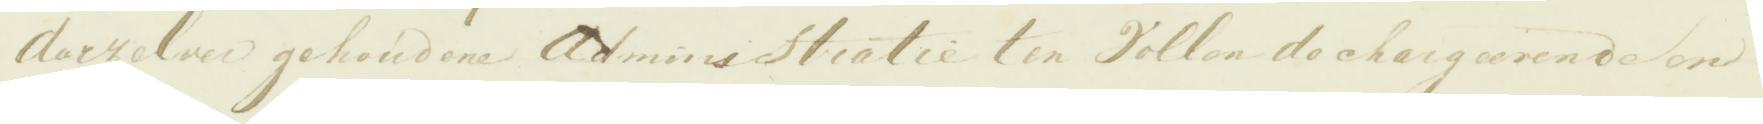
derzelver gehoudene Administratie ten Vollen dechargeerende en
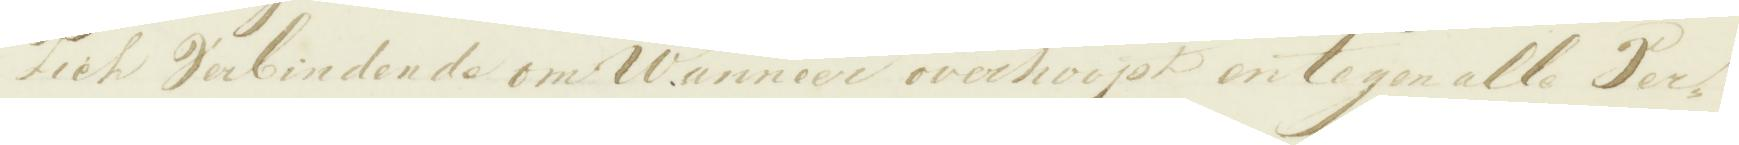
zich Verbindende om Wanneer overhoopt en tegen alle Ver„
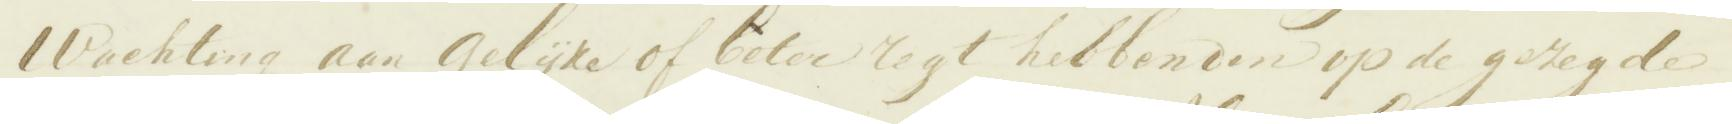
Wachting aan gelijke of beter regt hebbenden op de gezegde
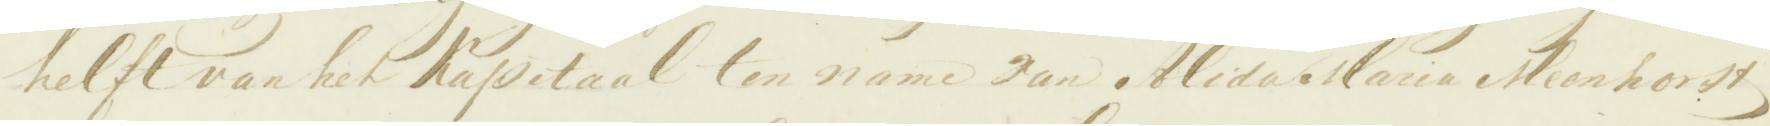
helft van het Kapitaal ten name van Alida Maria Meenhorst
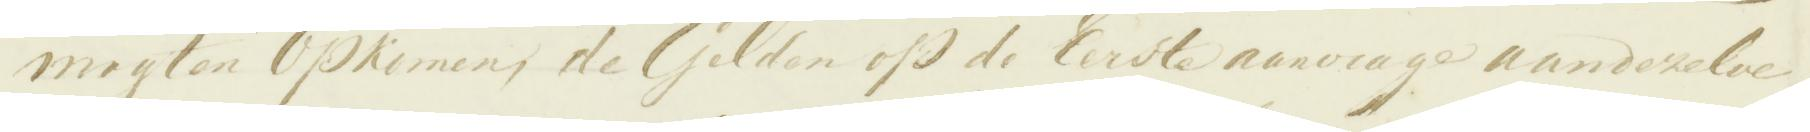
mogten Opkomen, de Gelden op de Eerste aanvrage aan dezelve
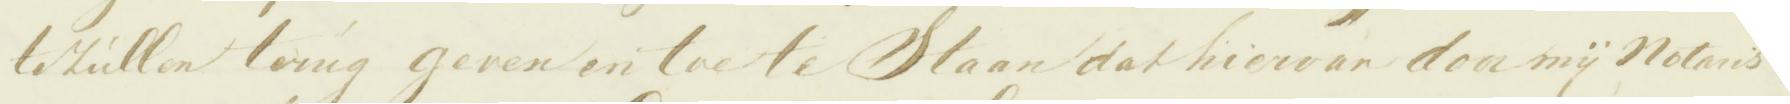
te zullen terug geven en toe te Staan dat hiervan door mij Notaris
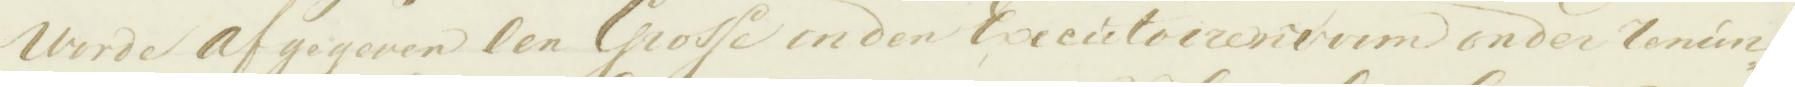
worde afgegeven een Grosse onder Executoire vorm onder renun=
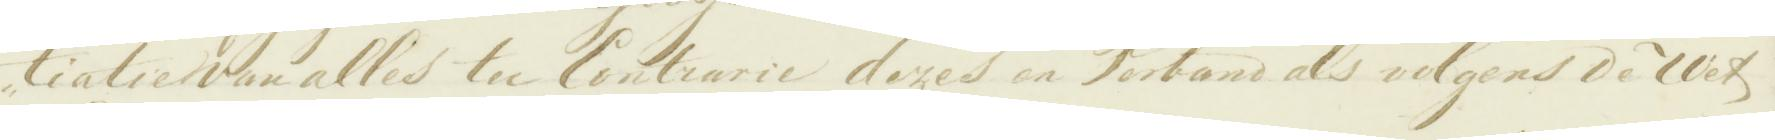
„tiatie van alles ter Contrarie dezes en Verband als volgens de wet
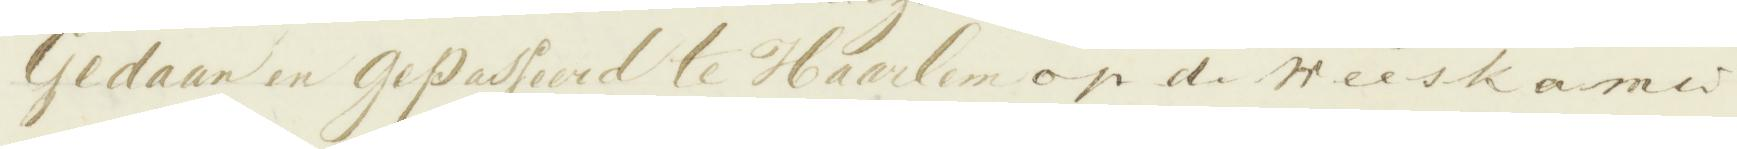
Gedaan en gepasseerd te Haarlem op de Weeskamer
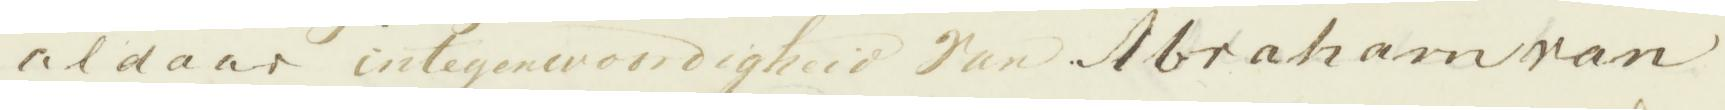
aldaar integenwoordigheid van Abraham van
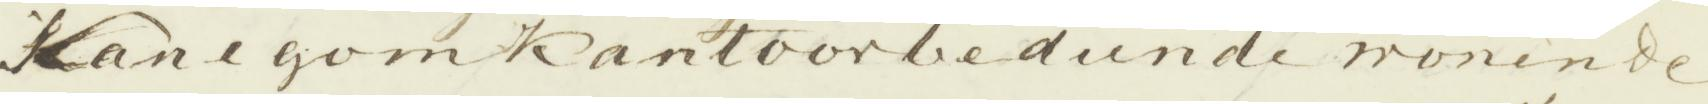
Kanegom Kantoorbediende wonende
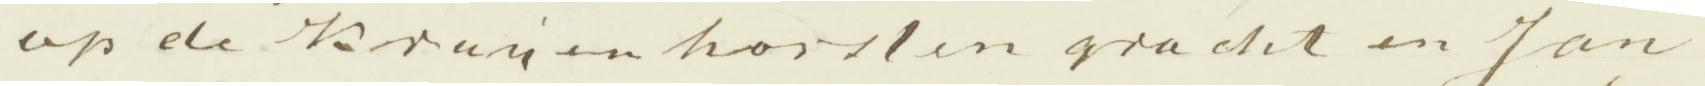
op de Krayenhorsten gracht en Jan
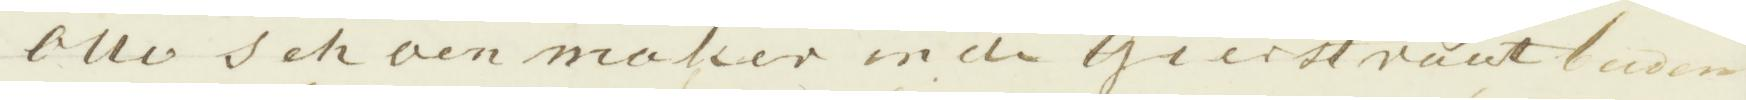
Otto schoenmaker in de Gierstraat beiden
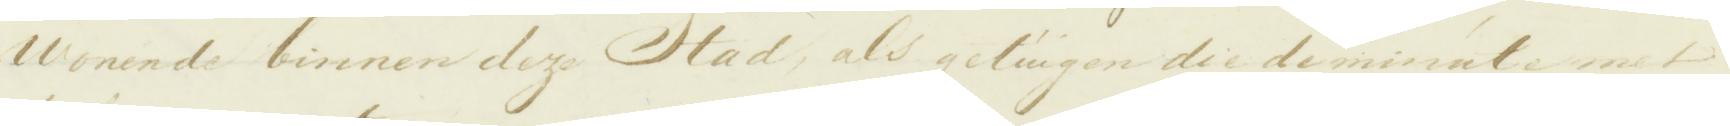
wonende binnen deze Stad, als getuigen die de minute met
